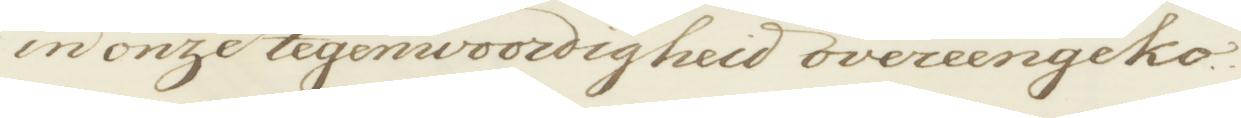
in onze tegenwoordigheid overeengeko.
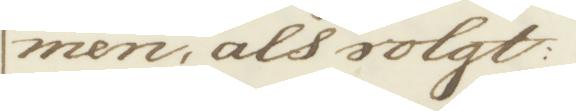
men, als volgt:
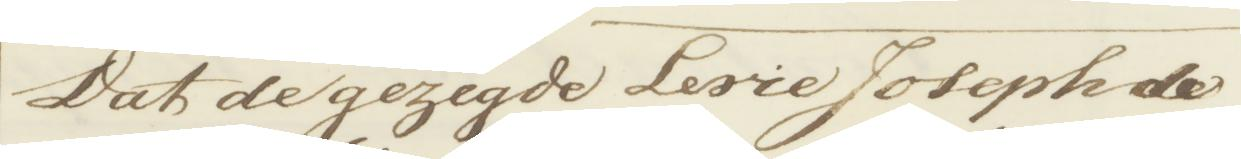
Dat de gezegde Levie Joseph de
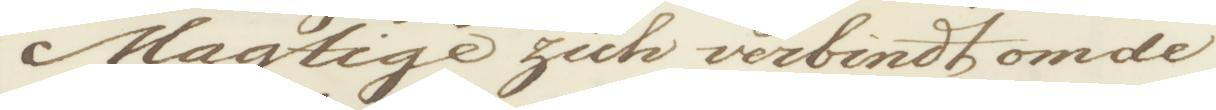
Magtige zich verbindt om de
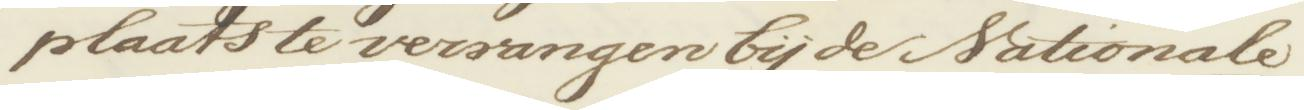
plaats te vervangen bij de Nationale
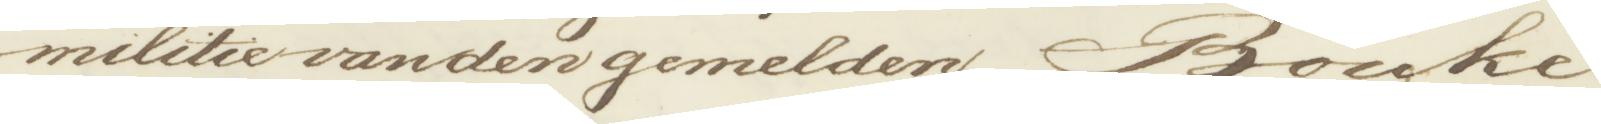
militie van den gemelden Bouke
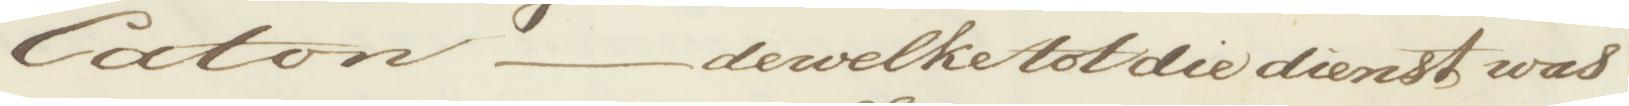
Caton — dewelke tot die dienst was
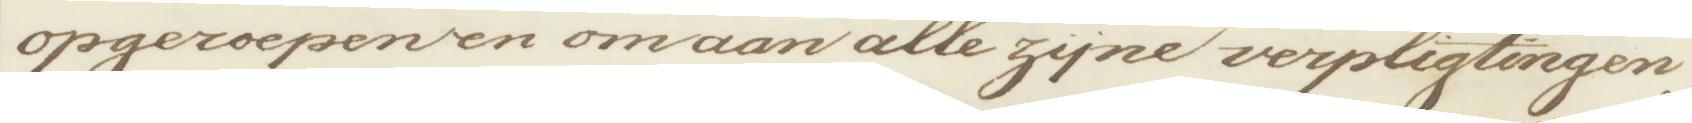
opgeroepen en om aan alle zijne verpligtingen
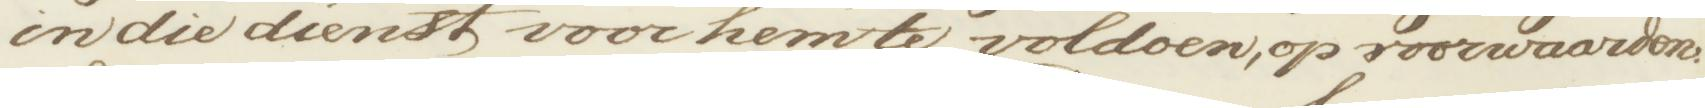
in die dienst voor hem te voldoen, op voorwaarden
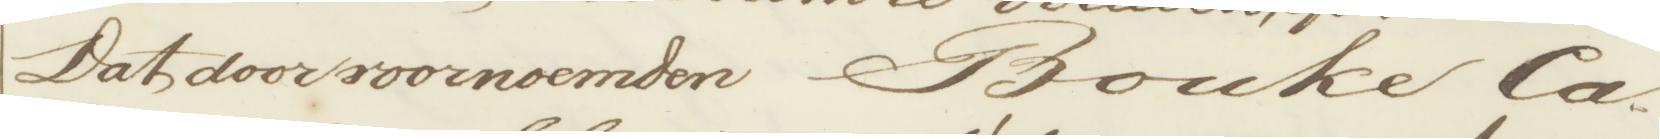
Dat door voornoemden Bouke Ca„
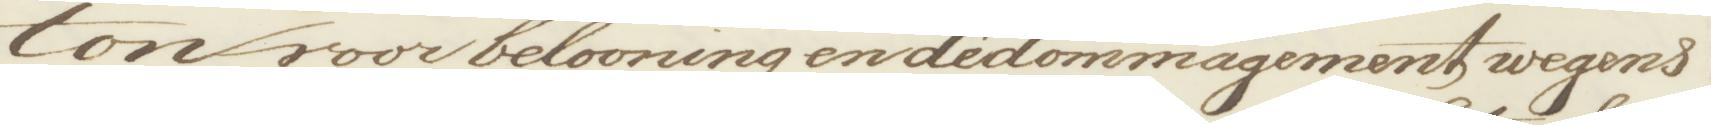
ton voor belooning en dédommagement wegens
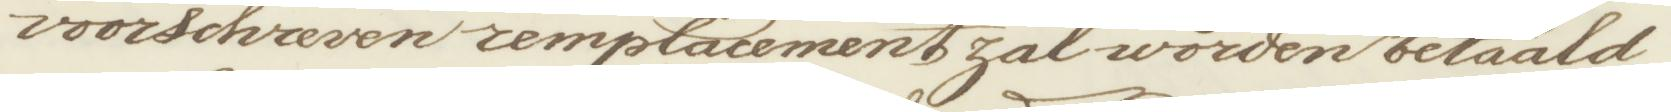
voorschreven remplacement zal worden betaald
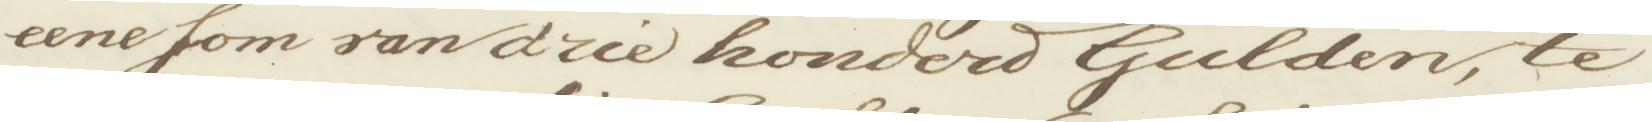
eene som van drie honderd Gulden, te
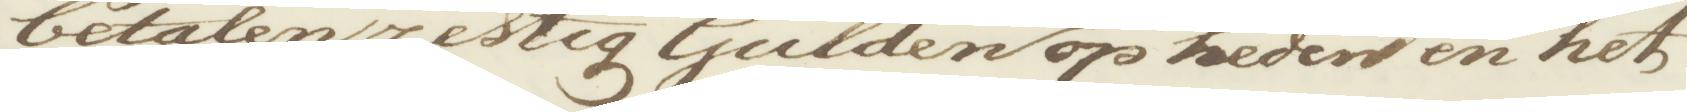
betalen zestig Gulden op heden en het
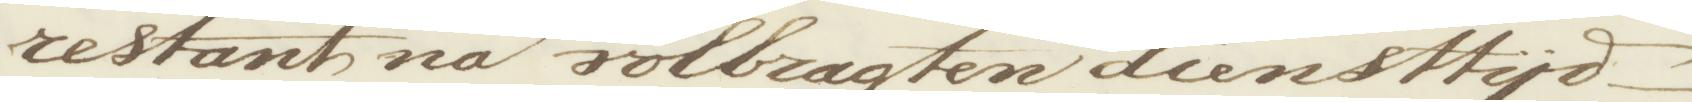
restant na volbragten diensttijd-
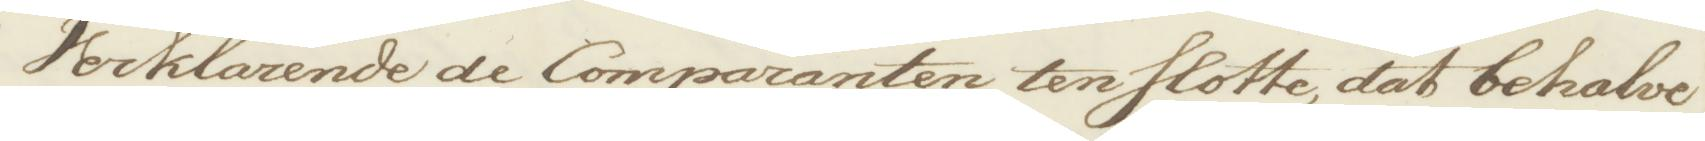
Verklarende de Comparanten ten slotte, dat behalve
